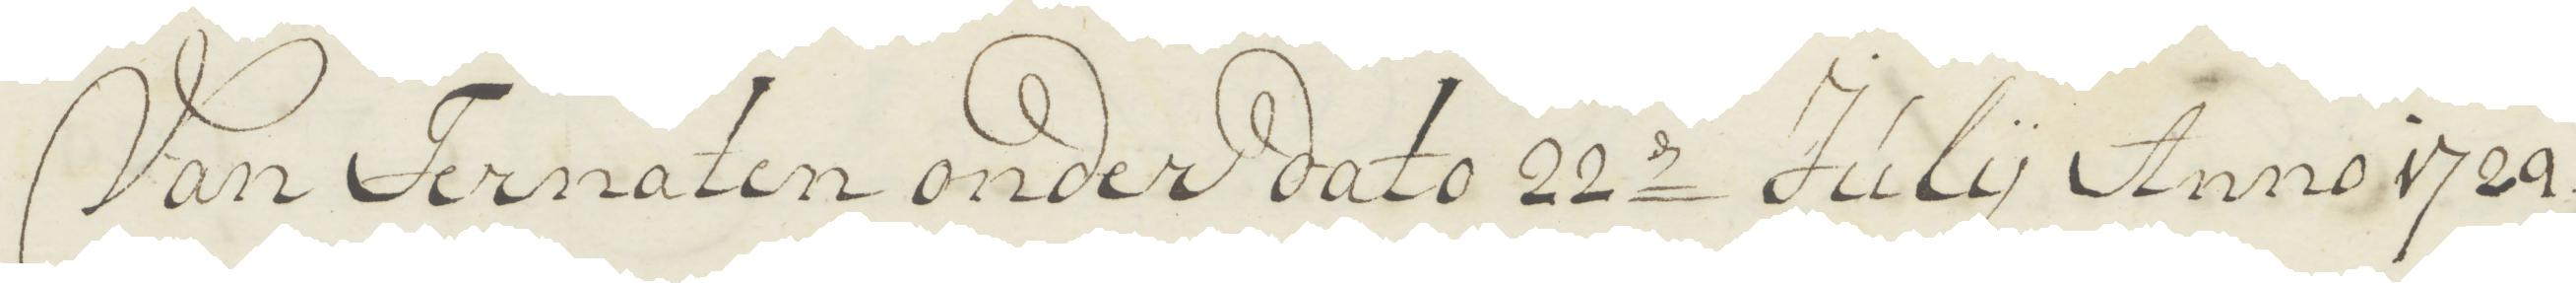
Van Ternaten onder dato 22=en Iulij Anno 1724
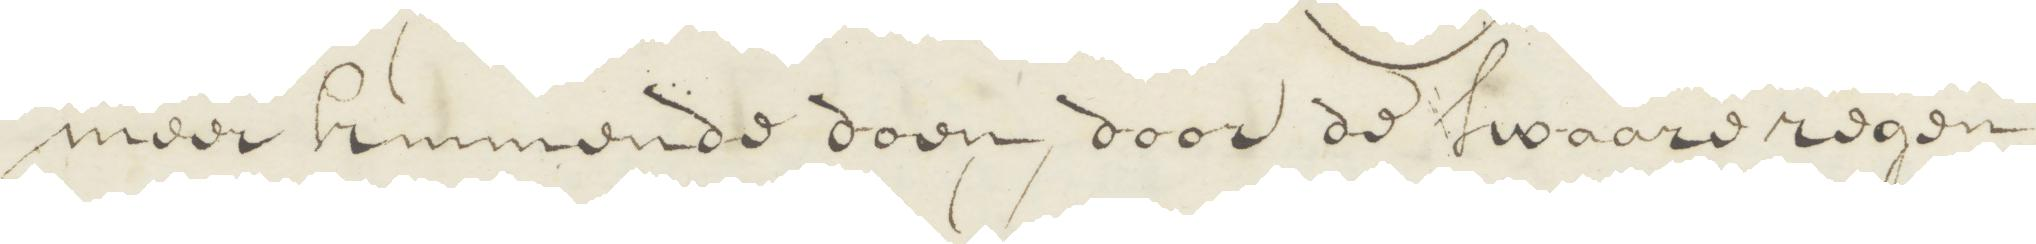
meer kunnende doen, door de swaare regen
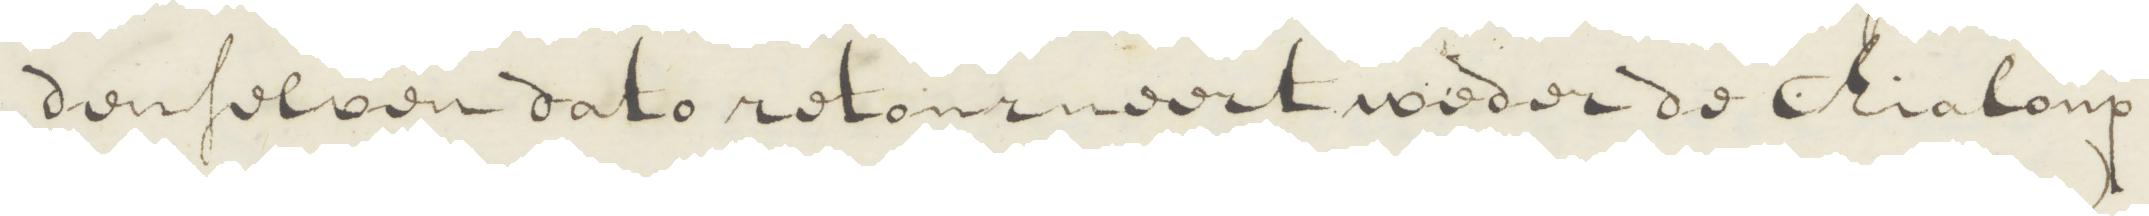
denselven dato retourneert weder de Chialoup
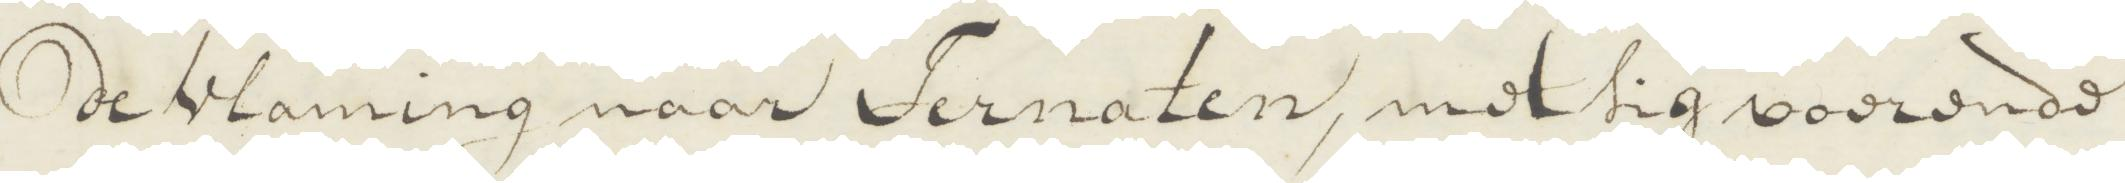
de Vlaming naar Ternaten, met sig voerende
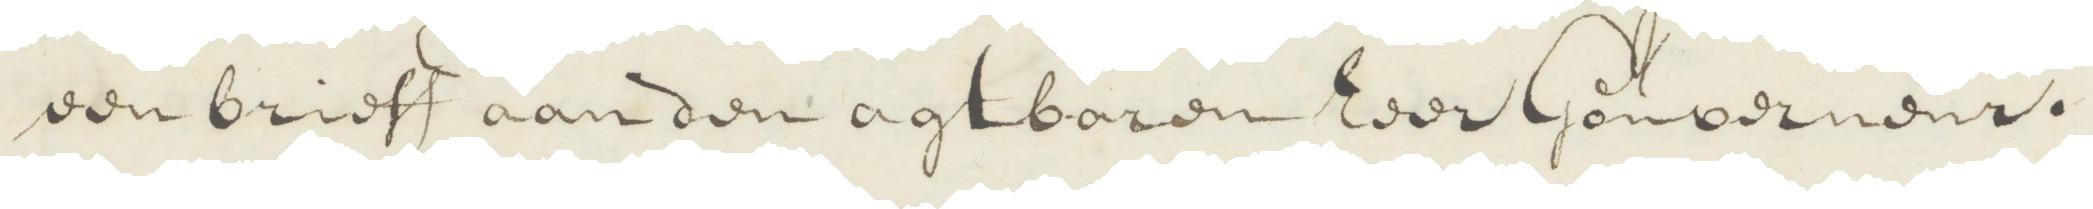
een brieff aan den agtbaren heer Gouverneur.
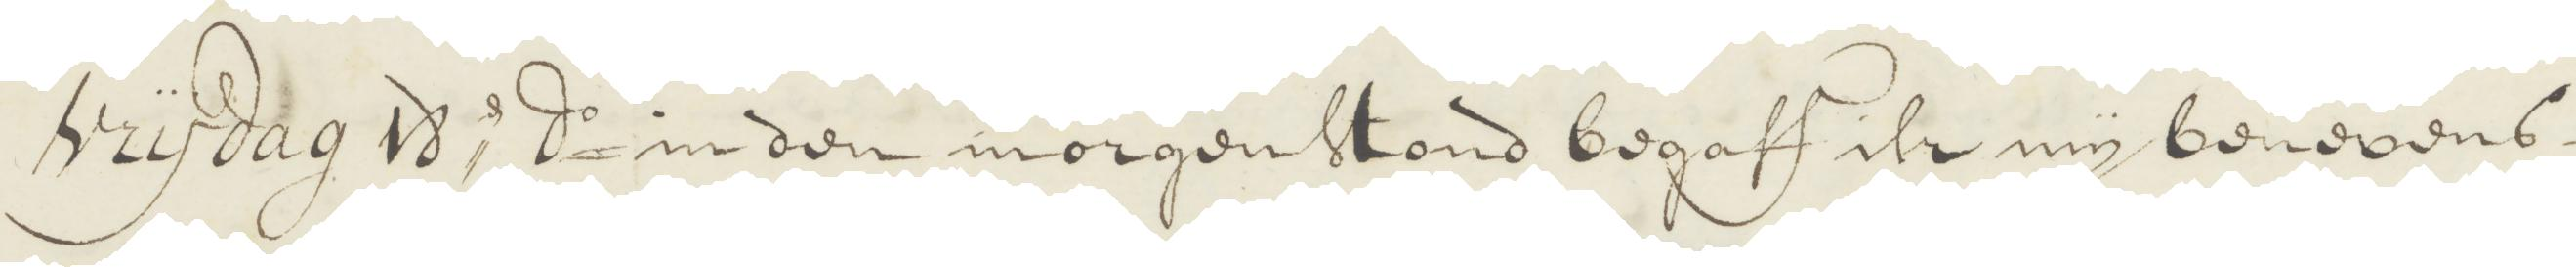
Vrijdag 18„en d=o in den morgenstond begaff ik mij benevens
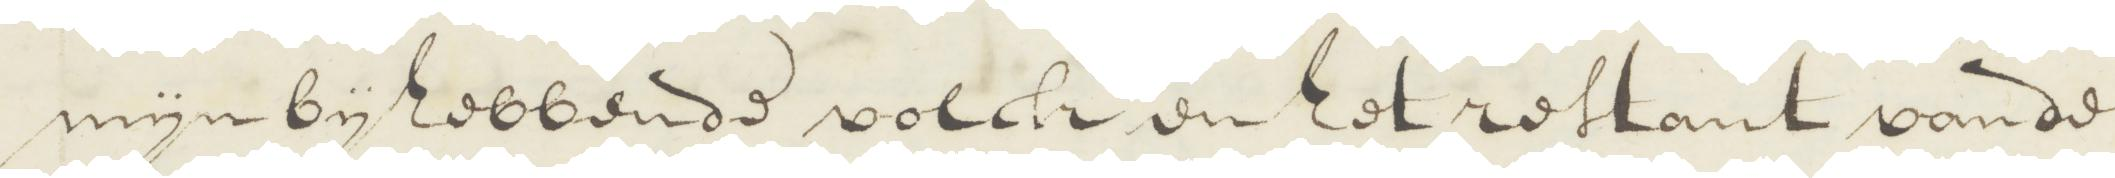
mijn bij hebbende volck en het restant van de
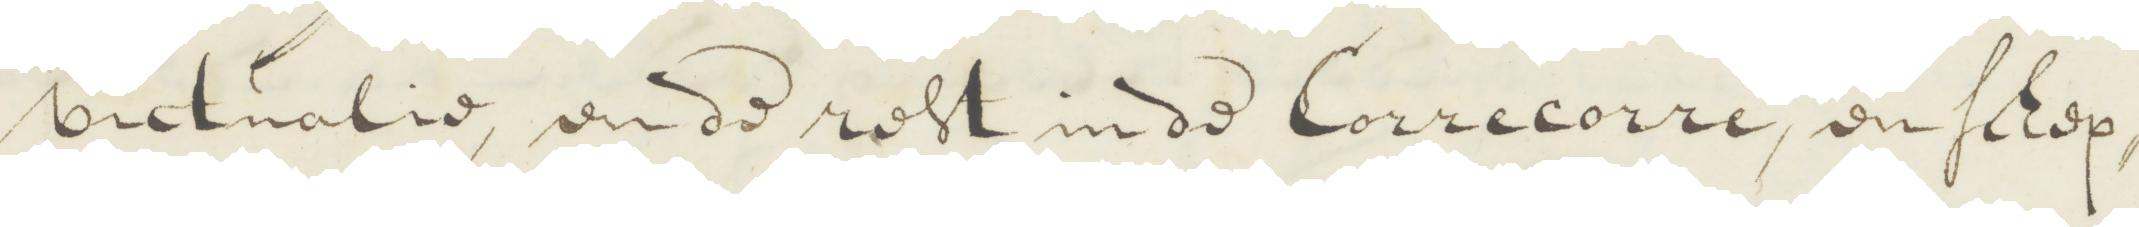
victualie, en de rest in de Correcorre, en Schep„
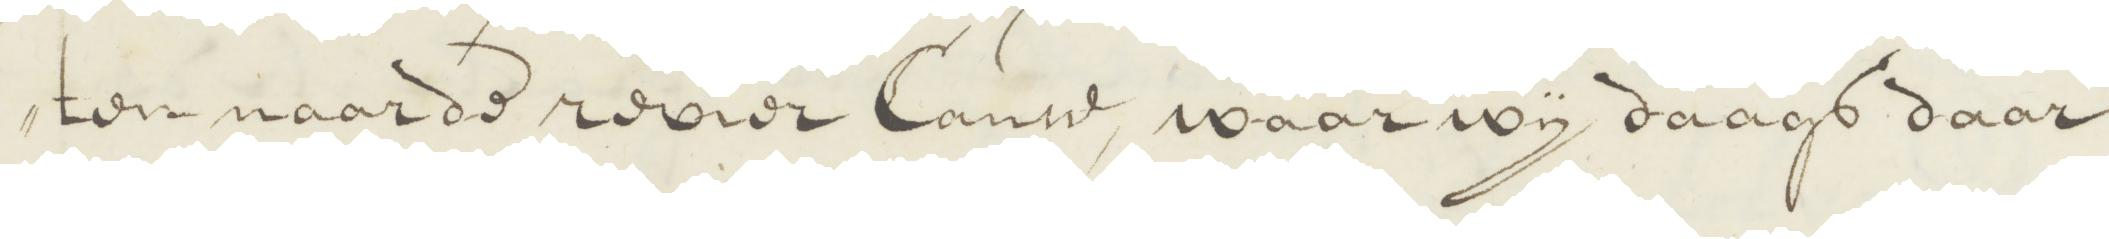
„ten naar de revier Cauw, waar wij daags daar
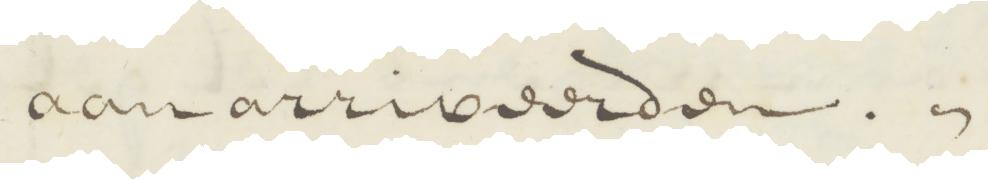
aan arriveerden.-
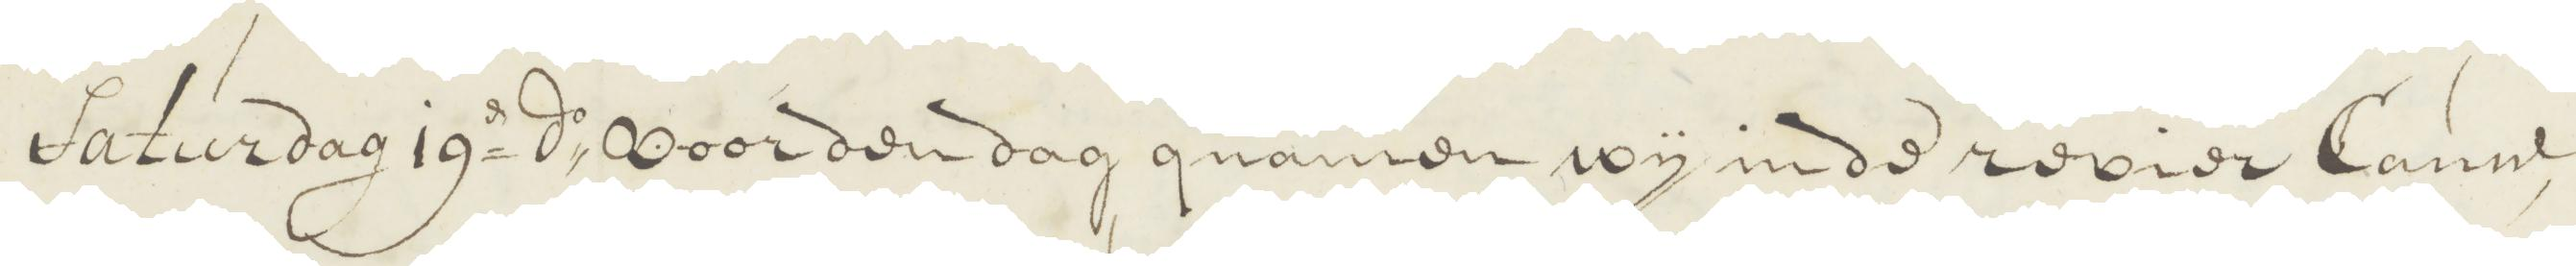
Saturdag 19=en d„o Voor den dag quamen wij in de revier Cauw,
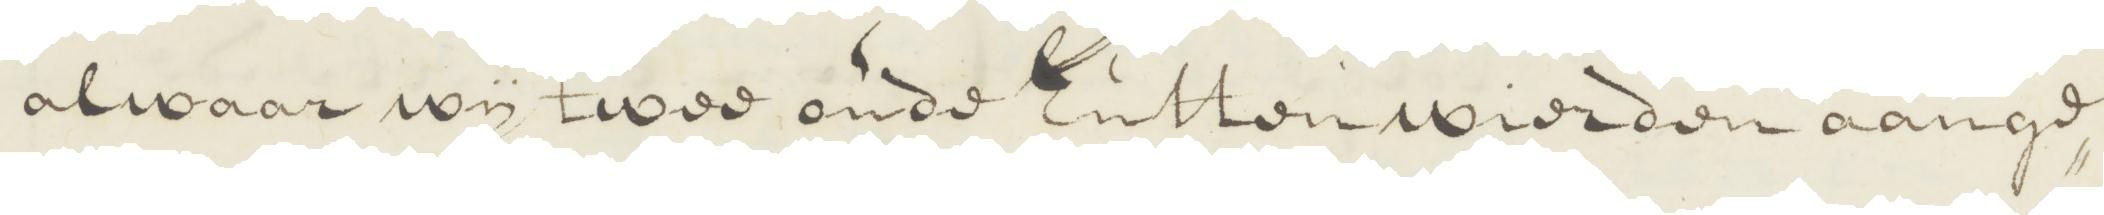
alwaar wij twee oude hutten wierden aange„
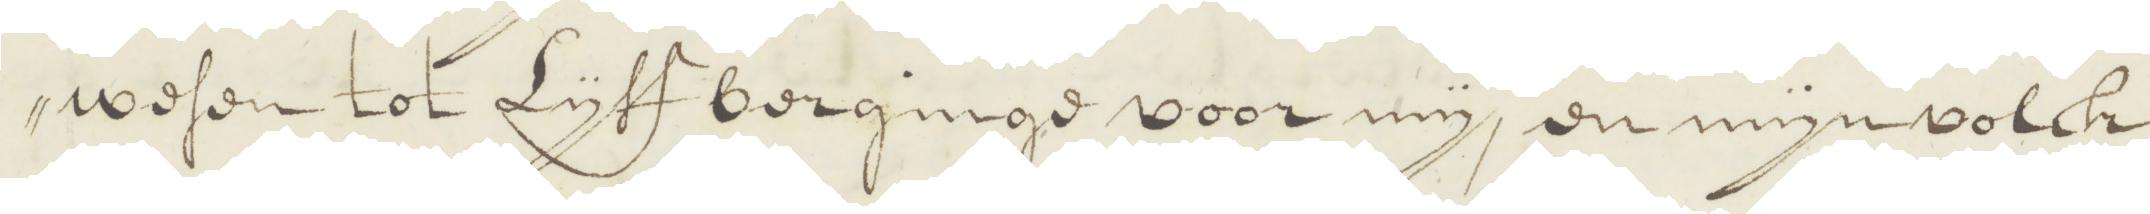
„wesen tot Lijff berginge voor mij, en mijn volck
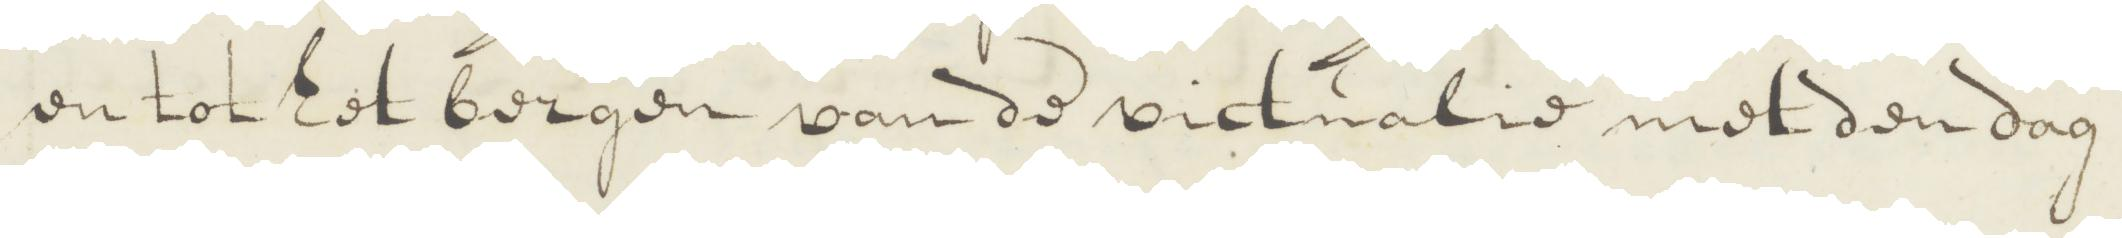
en tot het bergen van de victualie met den dag
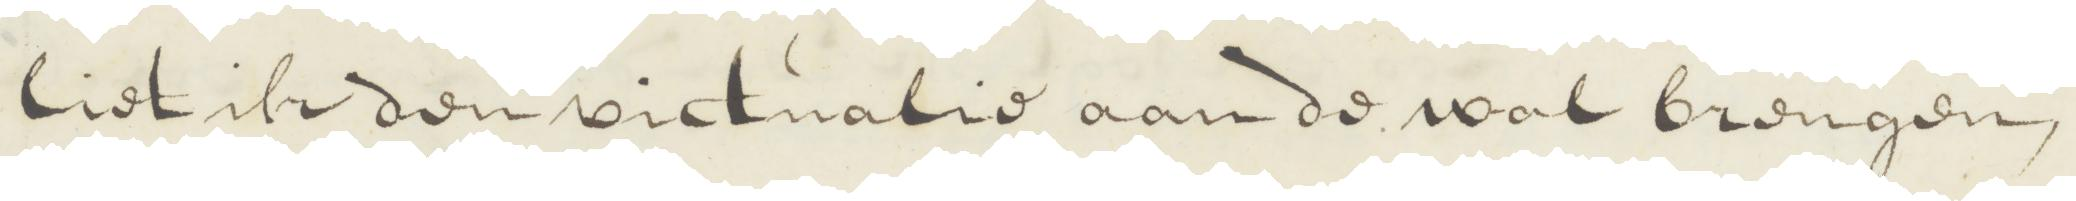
liet ik den victualie aan de wal brengen,
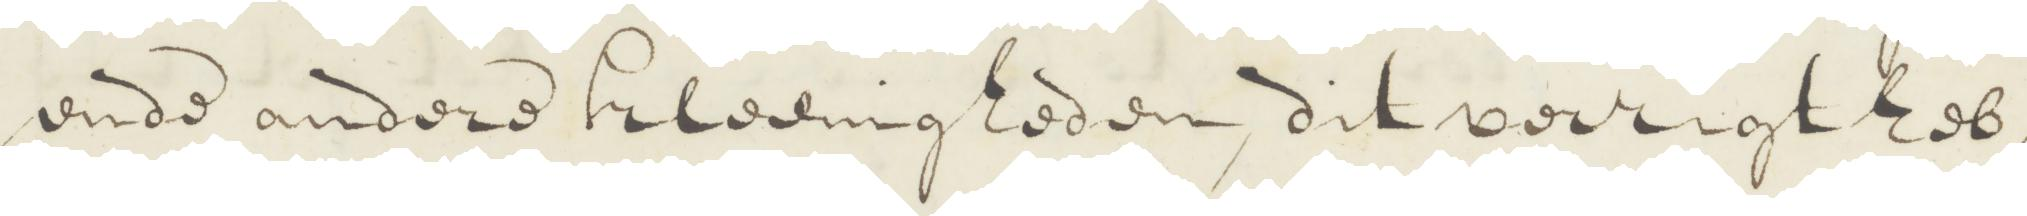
ende andere kleenigheden, dit verrigt heb„
